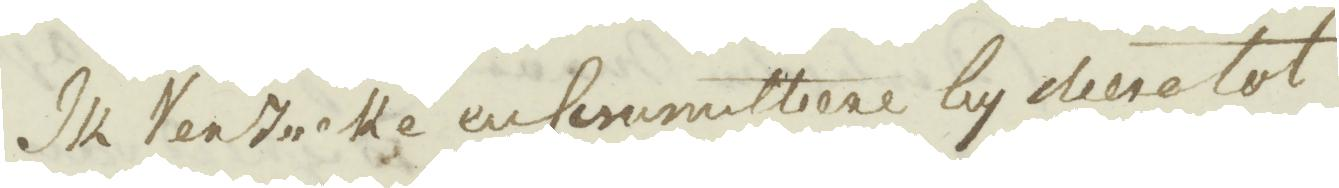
Ik Verzoeke en Committeere by deese tot
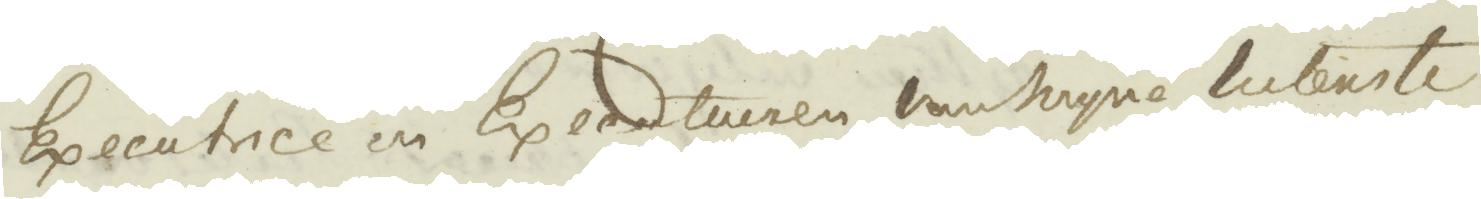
Executrice en Executeuren van myne Uiterste
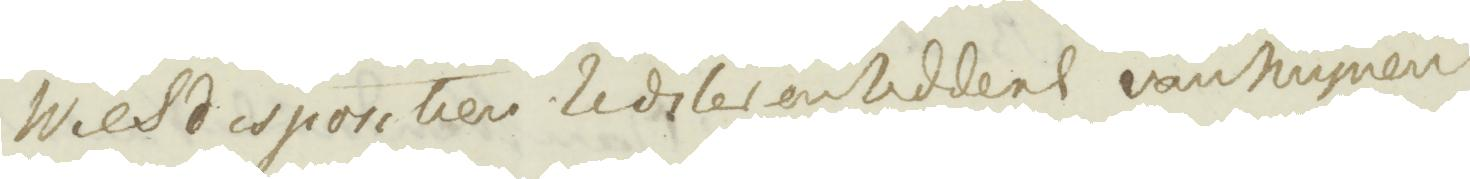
Wils dispositien redster en redders van mynen
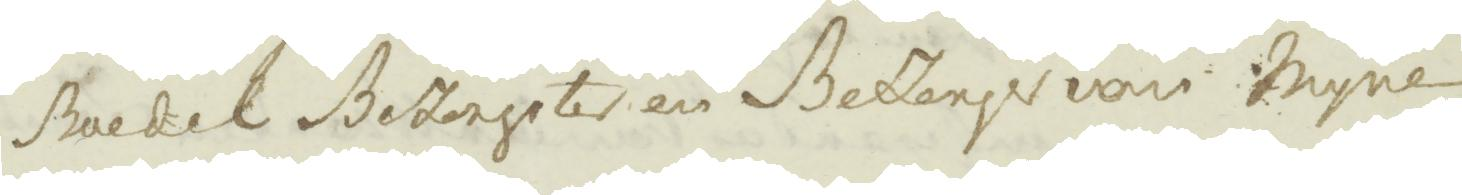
Boedel Bezorgster en Bezorger van myne
